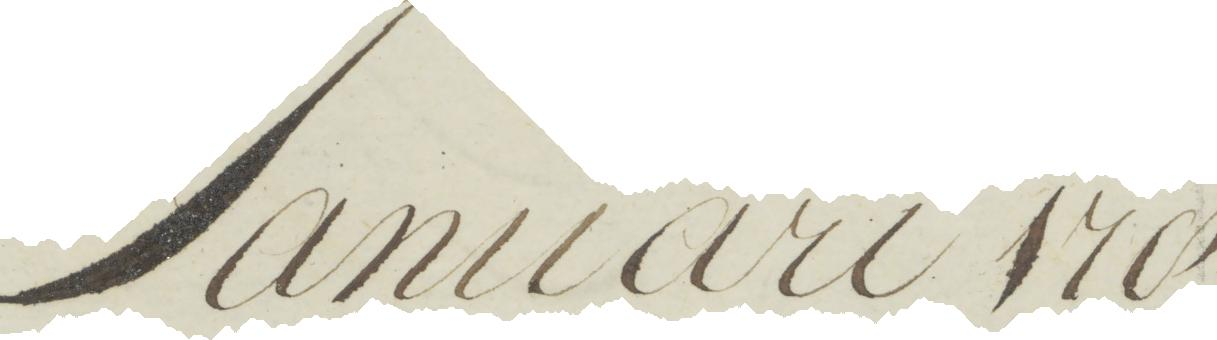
Den 10. Januari 1781.
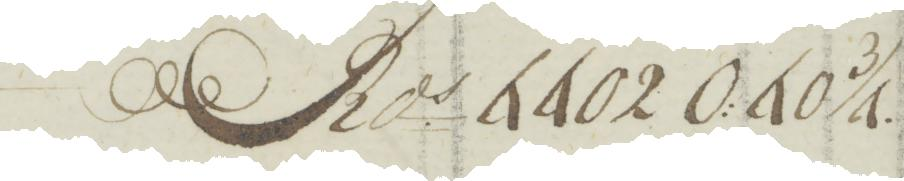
Rd=s 44020:40 3/4.
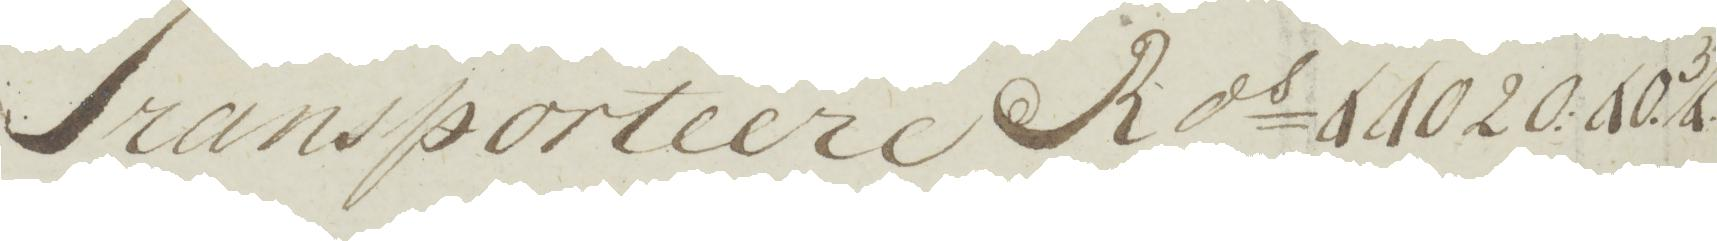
Transporteere Rd=s ƒ44020:40.3/4
